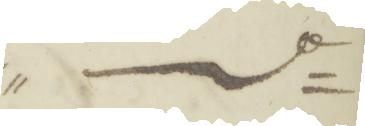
„ _=o
